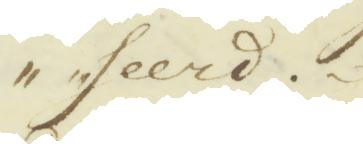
„ „seerd.—
